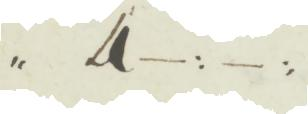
„ 4 —: —:
